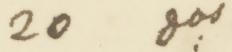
20 d:os
